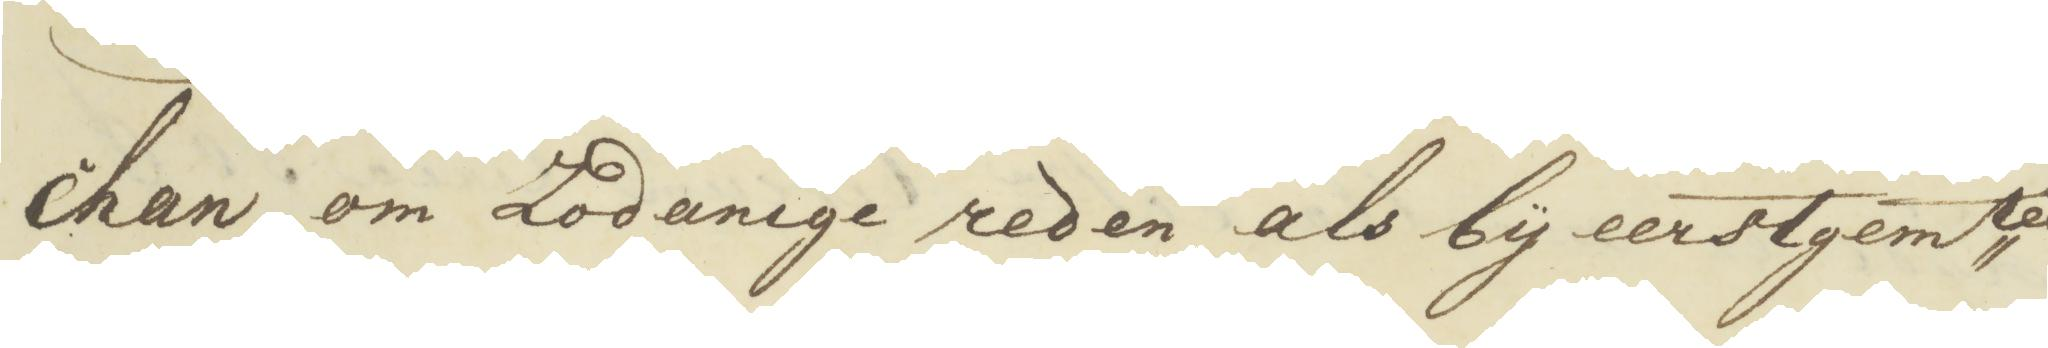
chan om zodanige reden als bij eerstgem„te
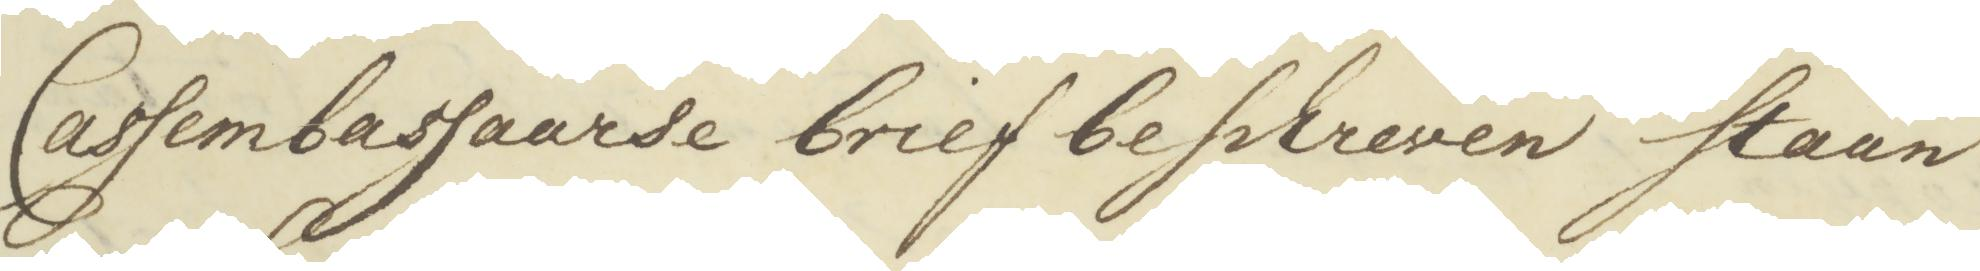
Cassembassaarse brief beschreven staan
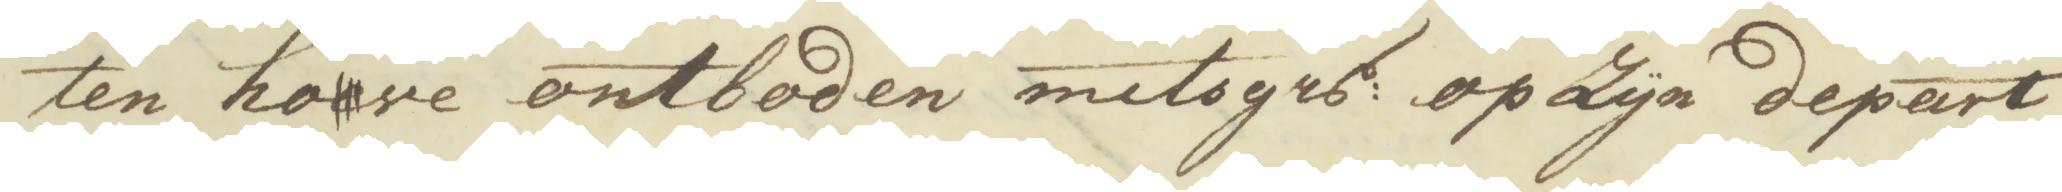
ten hoeve ontboden mitsgrs: op zijn depart
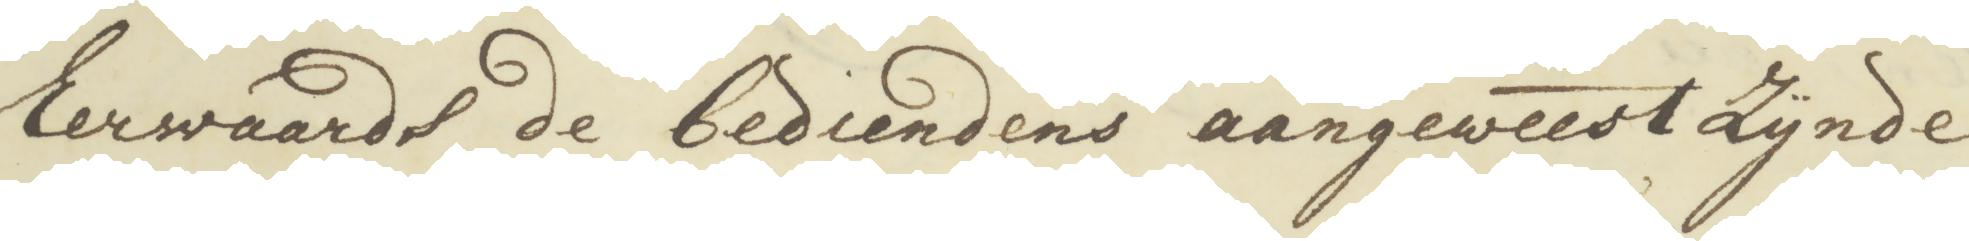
herwaards de bediendens aangeweest zijnde
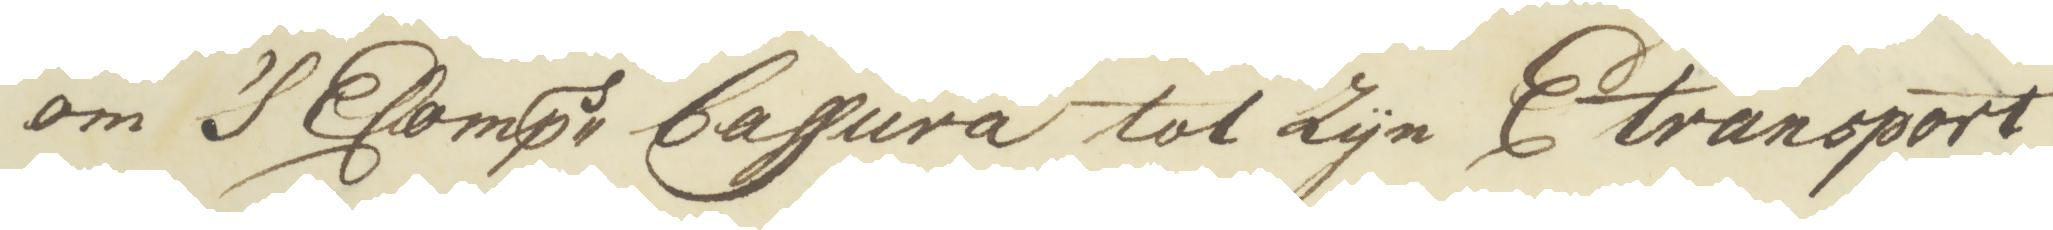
om ’s EComp„s bassura tot zijn E transport
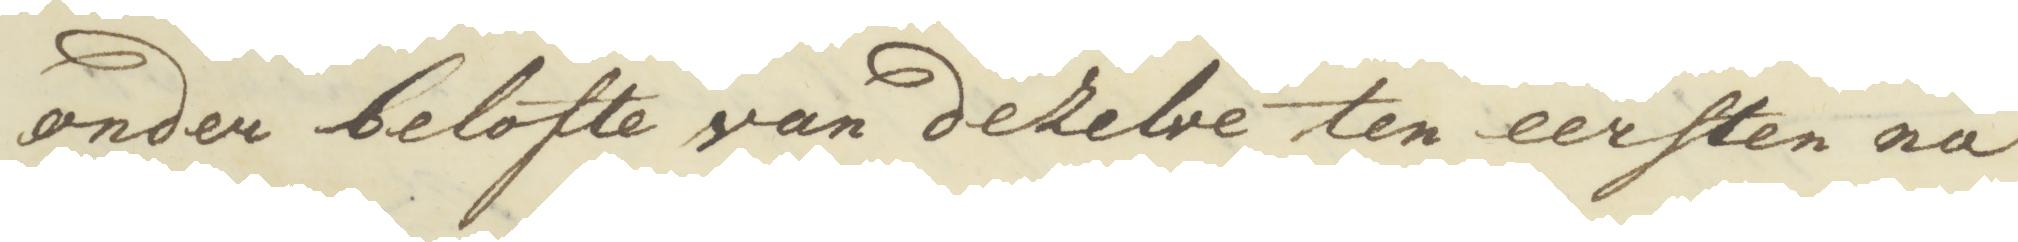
onder belofte van dezelve ten eersten na
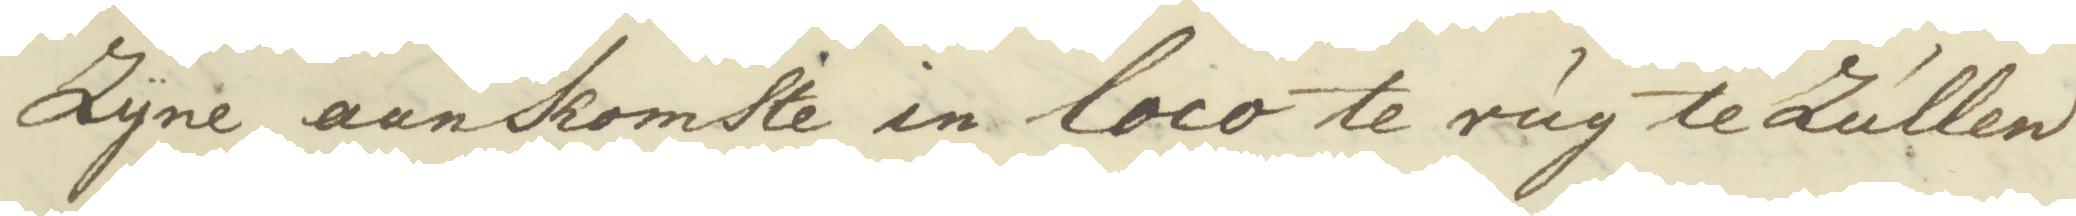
zijne aankomste in loco te rug te zullen
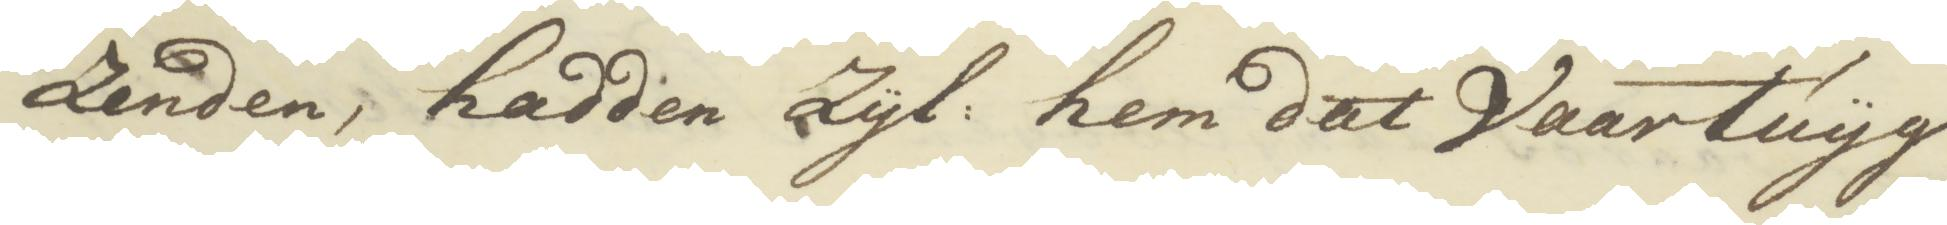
zenden, hadden zijl. hem dat Vaartuijg
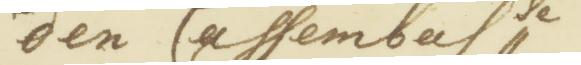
den Cassembas„se
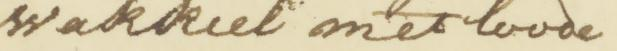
wakkiel met loode
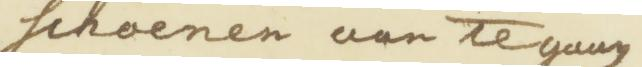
schoenen aan te gaan
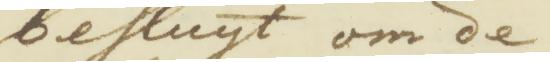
besluijt om de
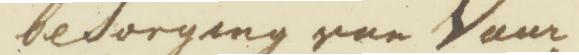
besorging van Vaar„
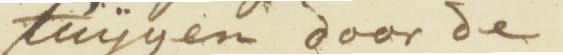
tuijgen door de
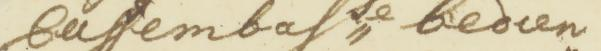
cassembas„se bedien
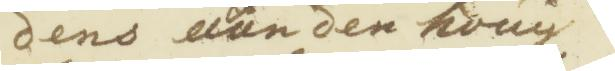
dens aan den houij
